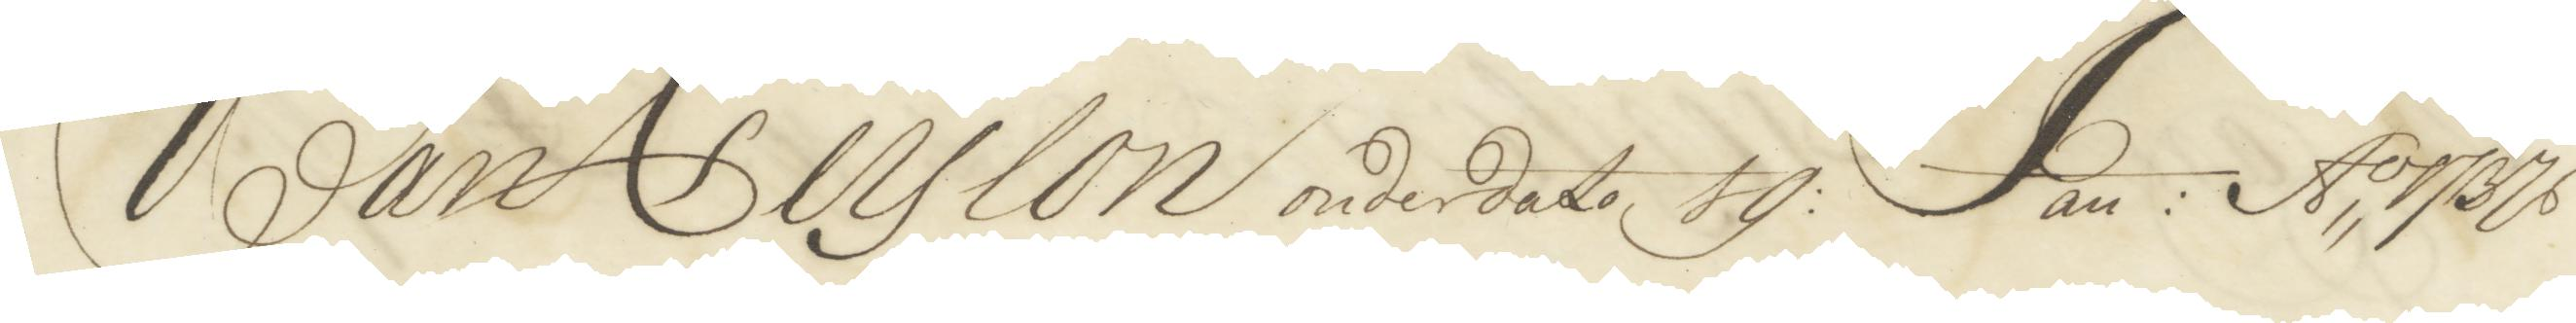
Van Ceijlon onder dato 19: Jan: A„o 1737
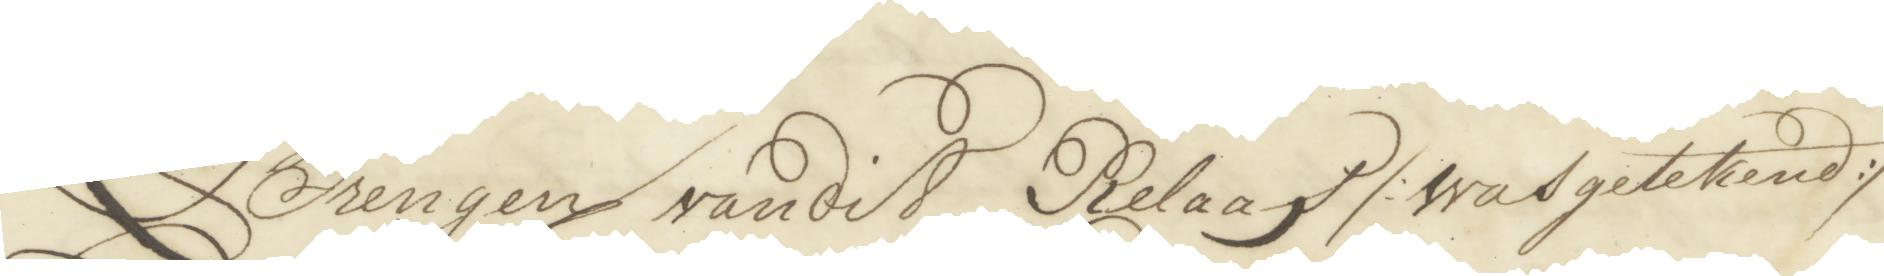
Brengen van dit Relaas /:was getekend:/
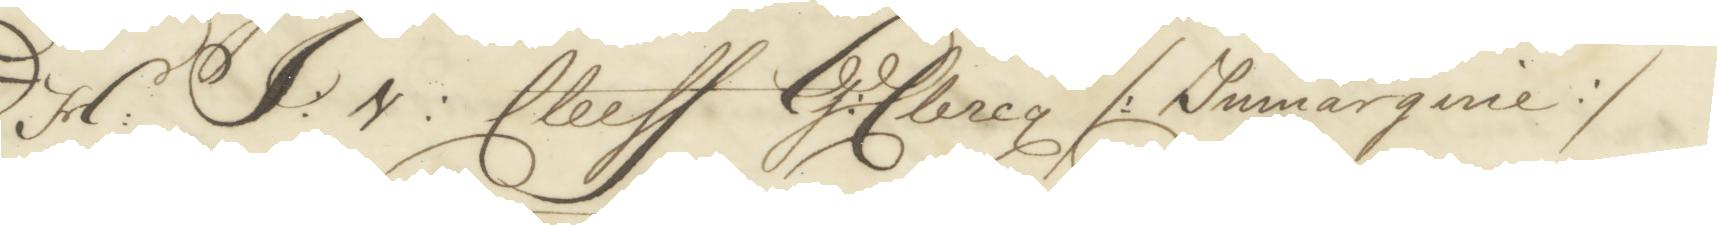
H: I: v: Cleeff G:Clercq /:Inmargine:/
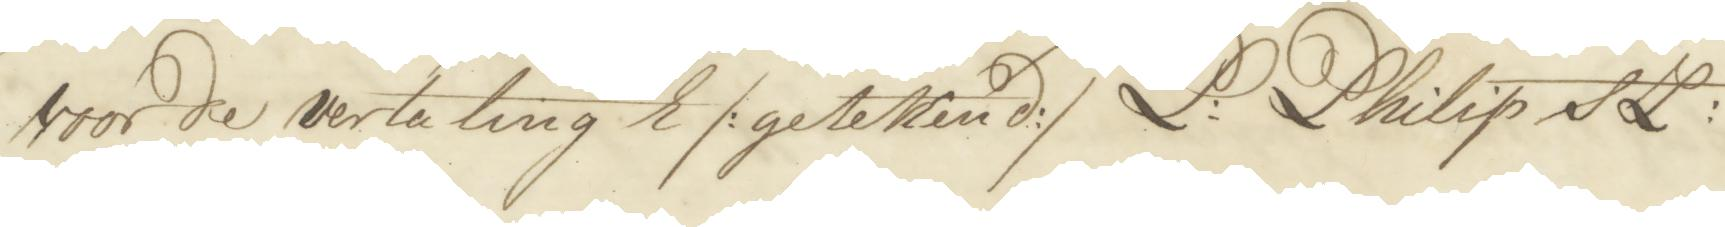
voor de vertaling h /:getekend:/ P: Philip Sz:
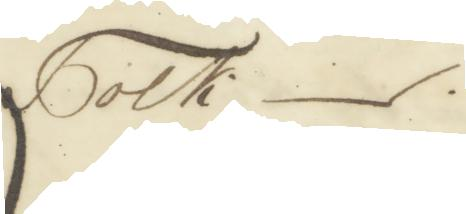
Folk —.
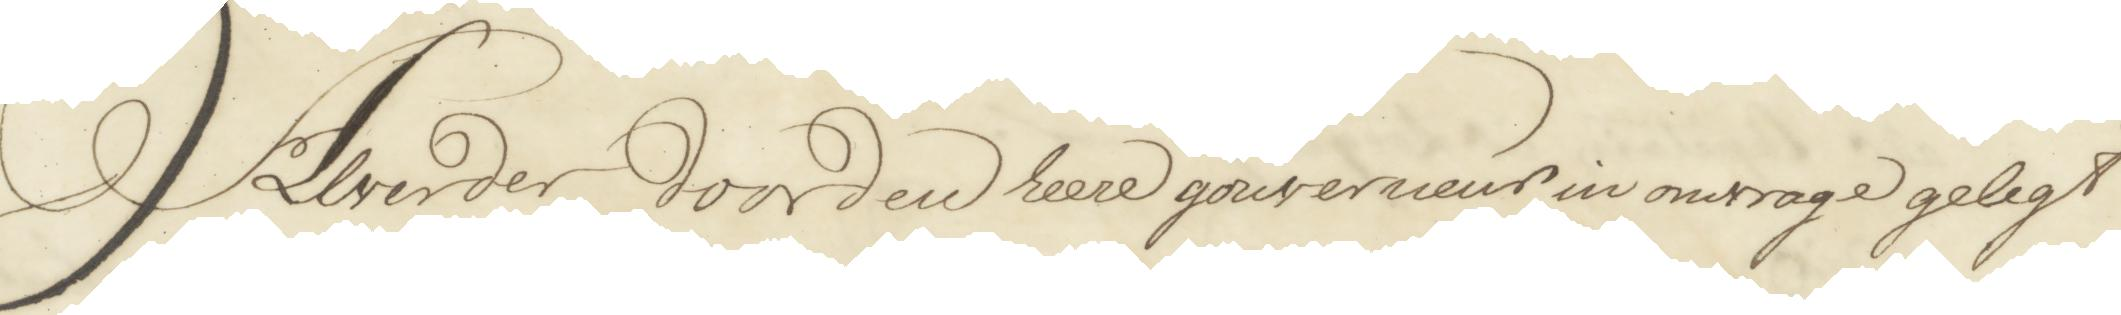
Alverder door den heere gouverneur in onvrage gelegt
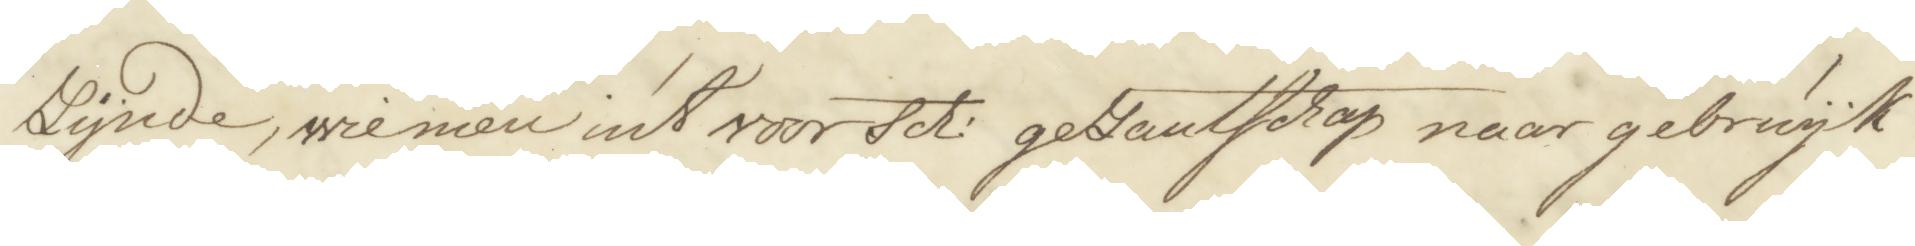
zijnde, wie men in't voorsch: gezantschap naar gebruijk
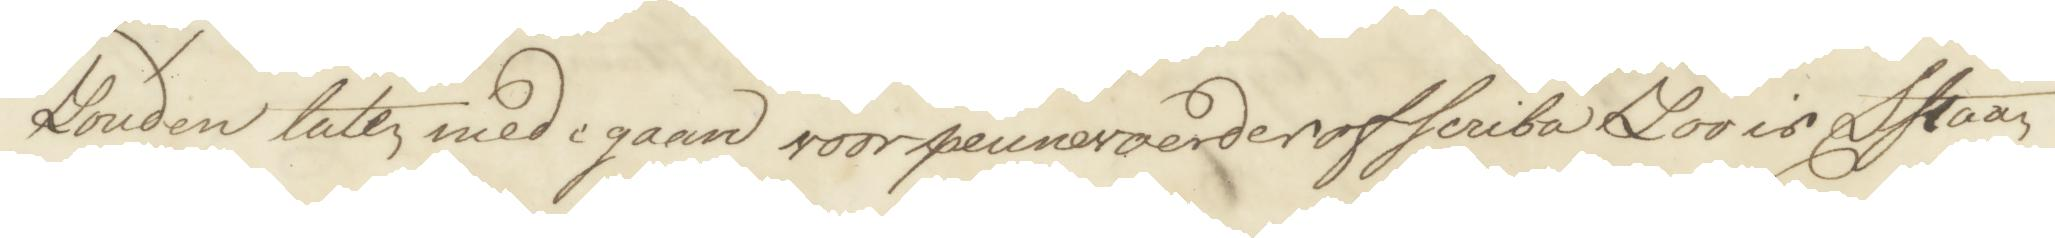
zouden laten mede gaan voor pennevoerder of scriba zoo is verstaan
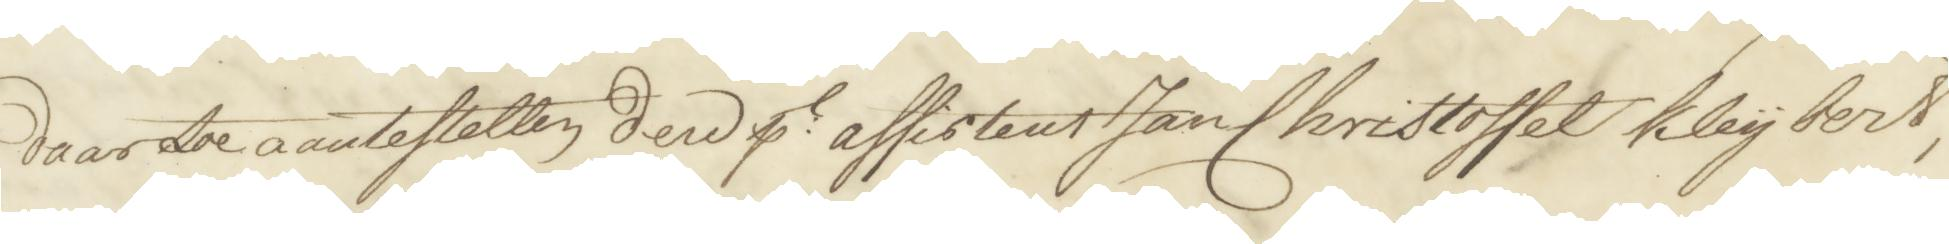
daar toe aantestellen den p:l assistent Jan Christoffel kleijbert,
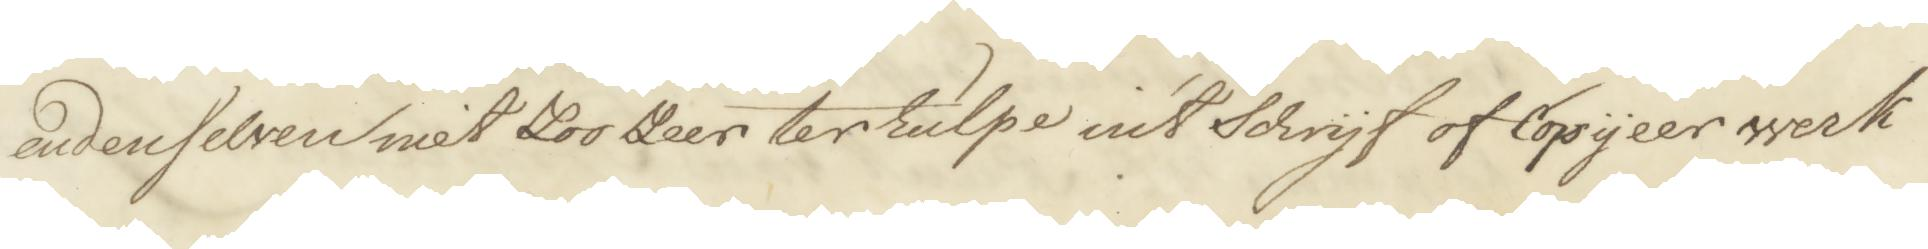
en denselven met zoo zeer ter hulpe in’t schrijf of Copijeer werk
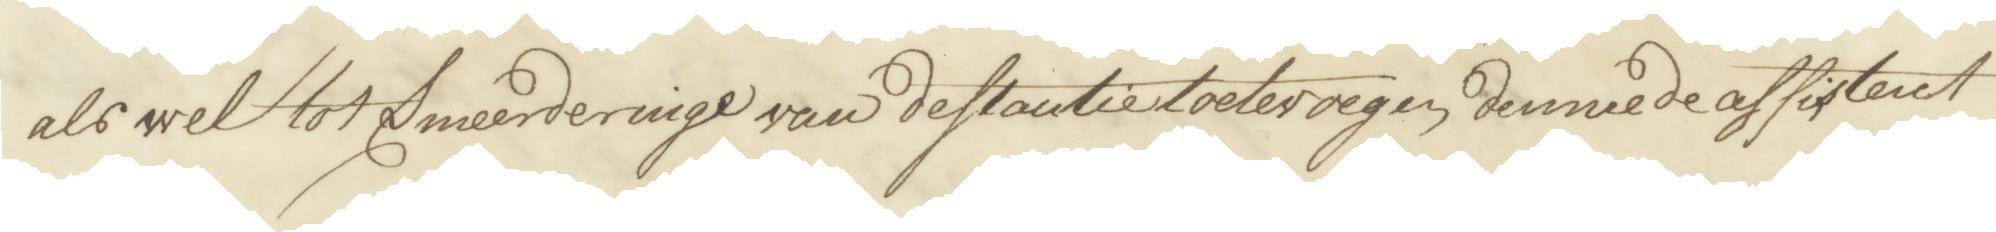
als wel tot vermeerderinge van destantie toetevoegen denmede assistent
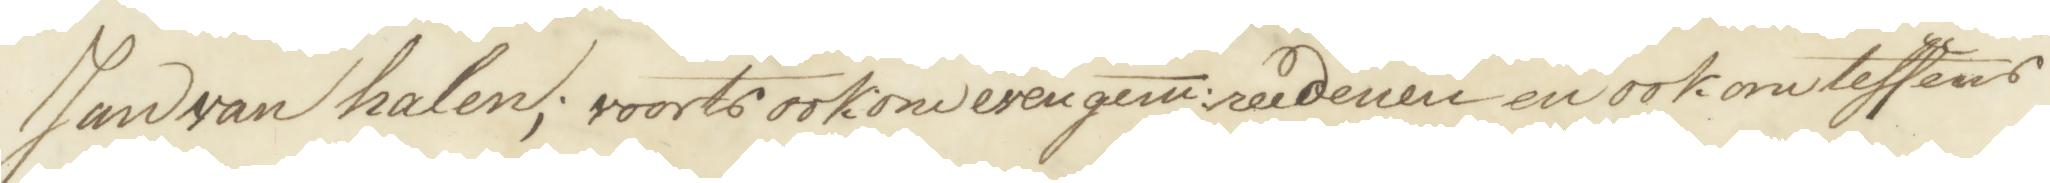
Jan van halen; voorts ook om even gem: reedenen en ook om teffens
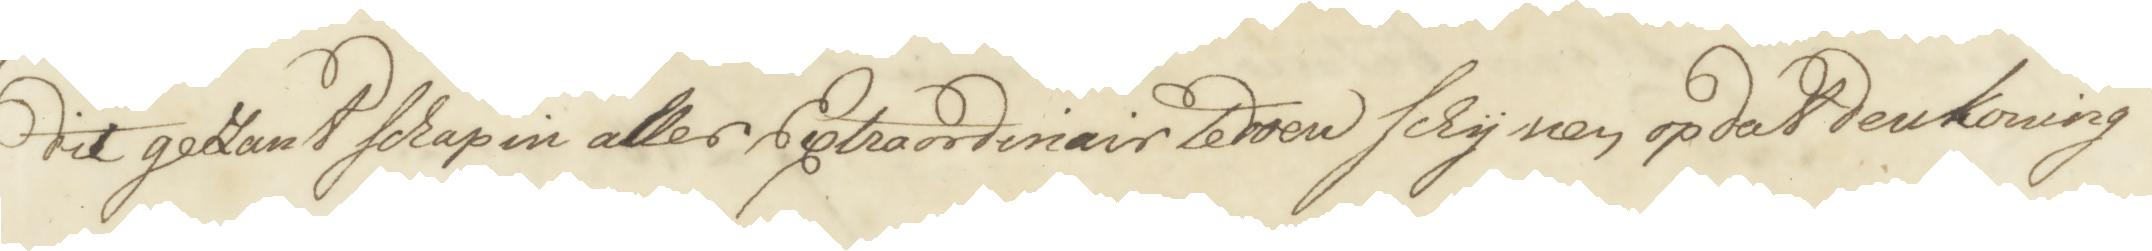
dit gezantschap in alles Extraordinair te doen schijven op dat den koning
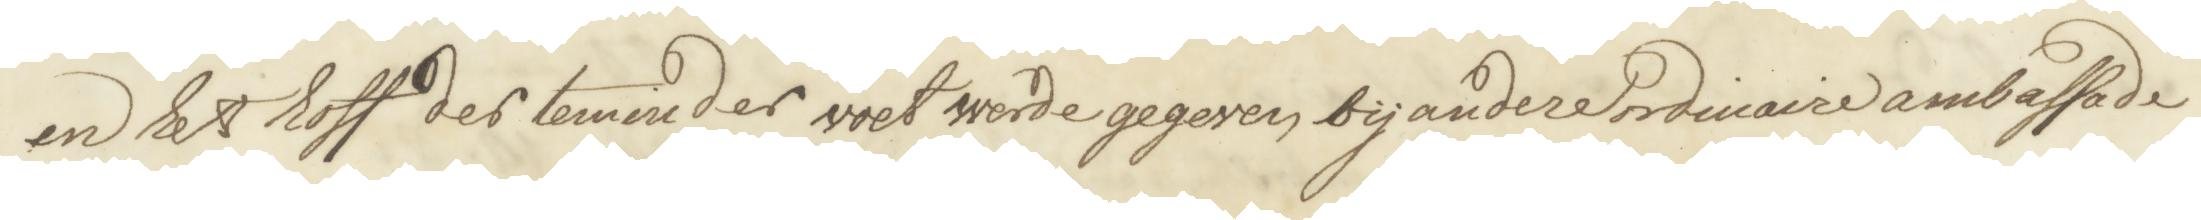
en het hoff des teminder voet werde gegeven bij andere ordinaire ambassade
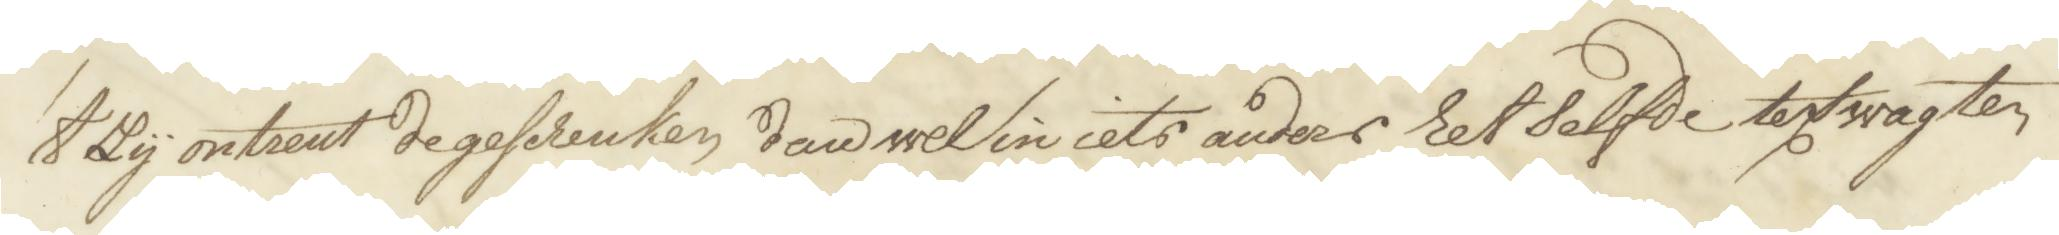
't zij ontrent de geschenken dan wel in iets anders het selfde te verwagten
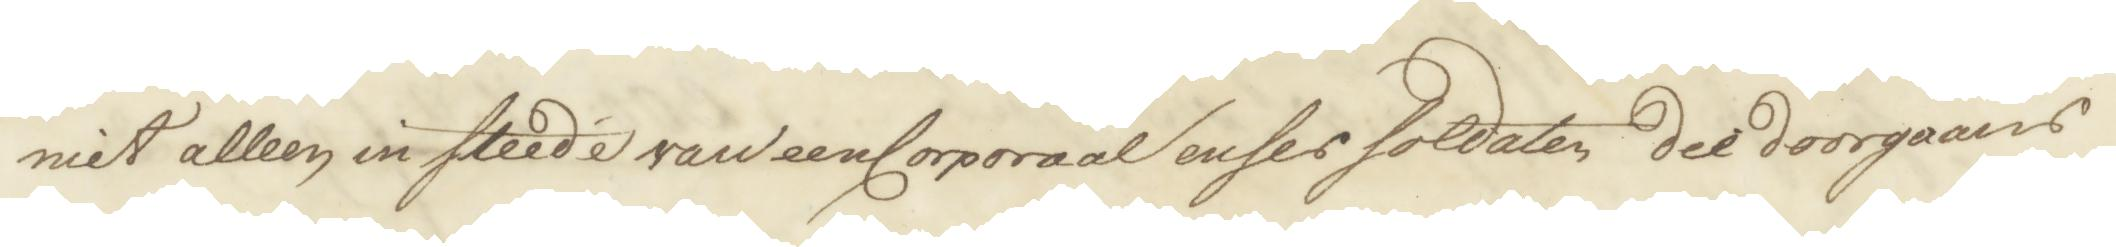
niet alleen in steede van een Corporaal enses soldaten die doorgaans
